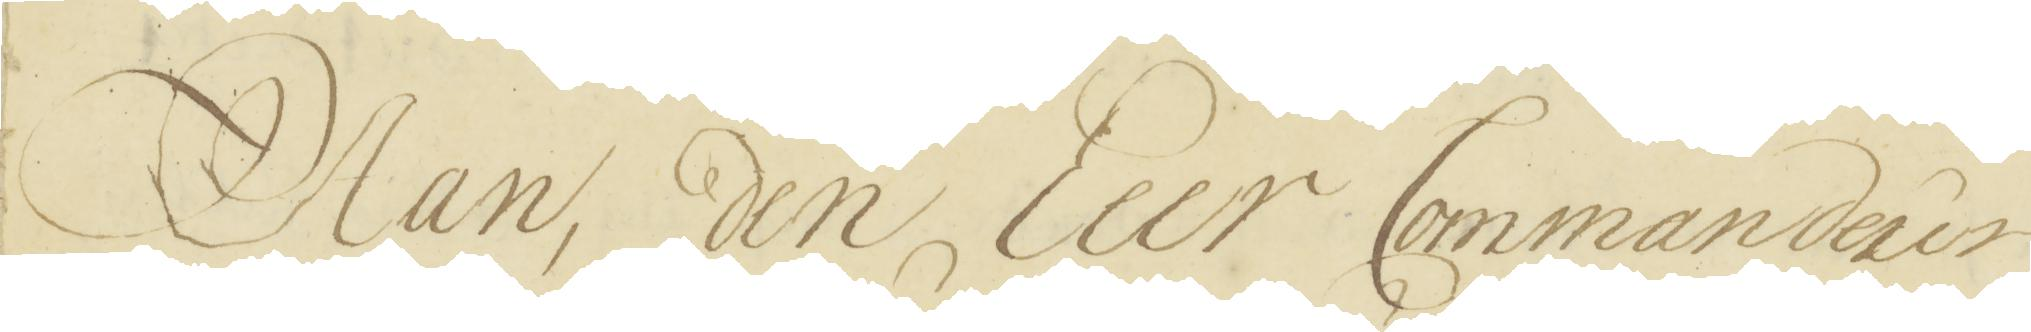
Aan, den heer Commandeur
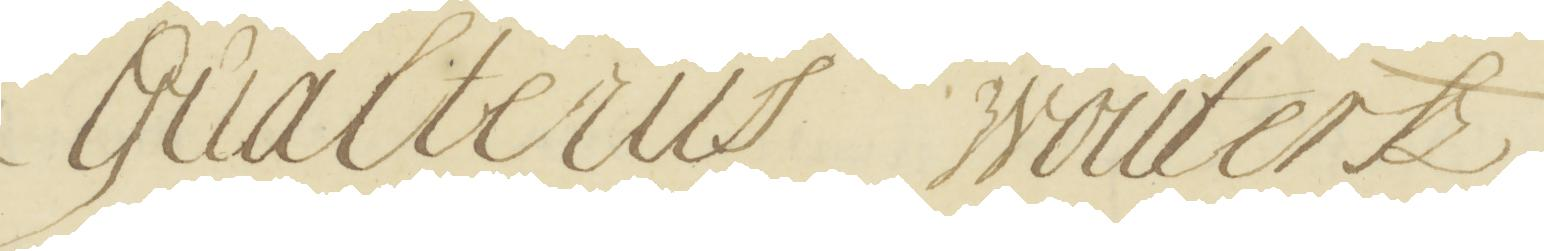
Qualterus Woutersz
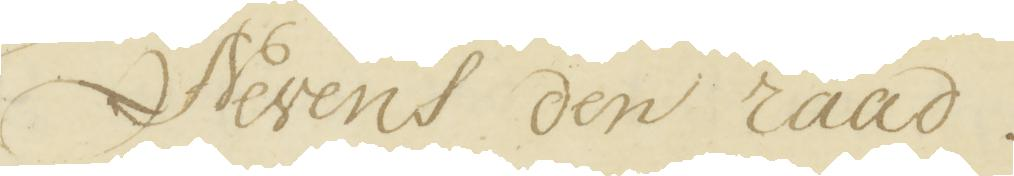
Nevens den raad.
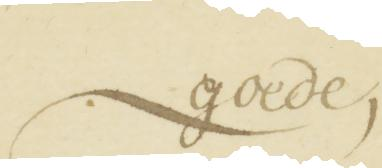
goede,
